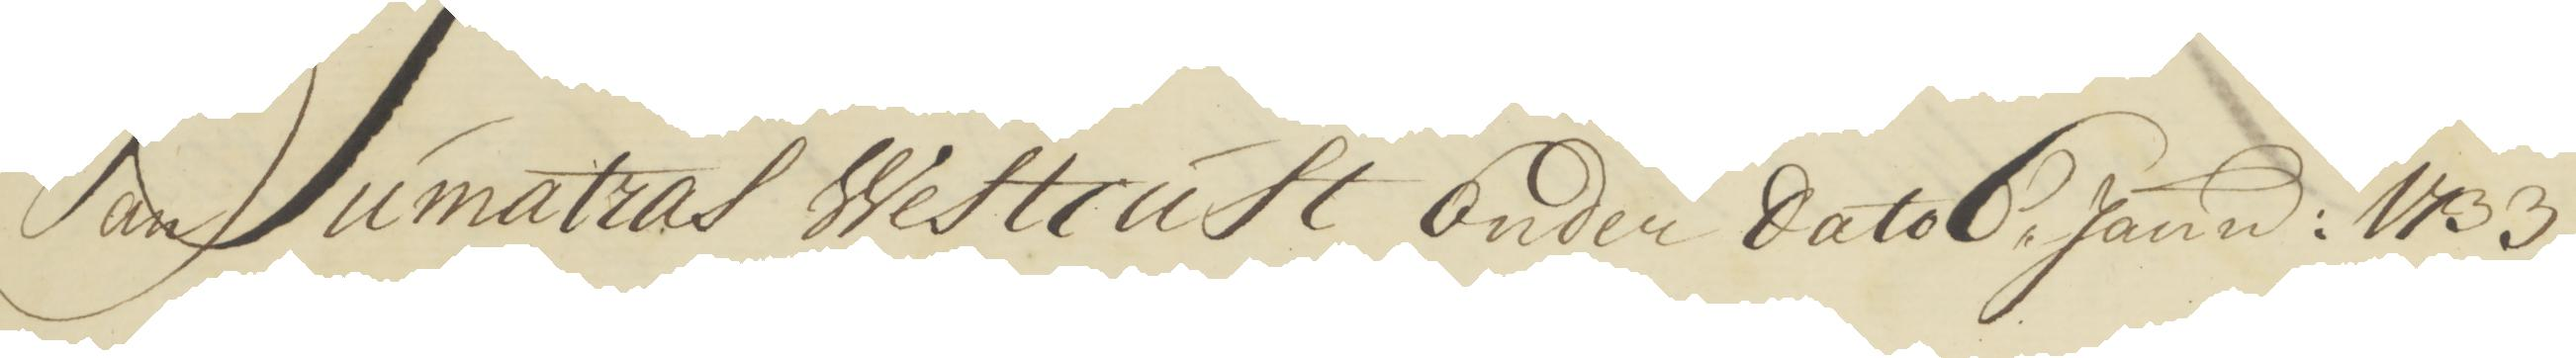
Van Sumatras westcust onder dato 6„e Jann: 1733
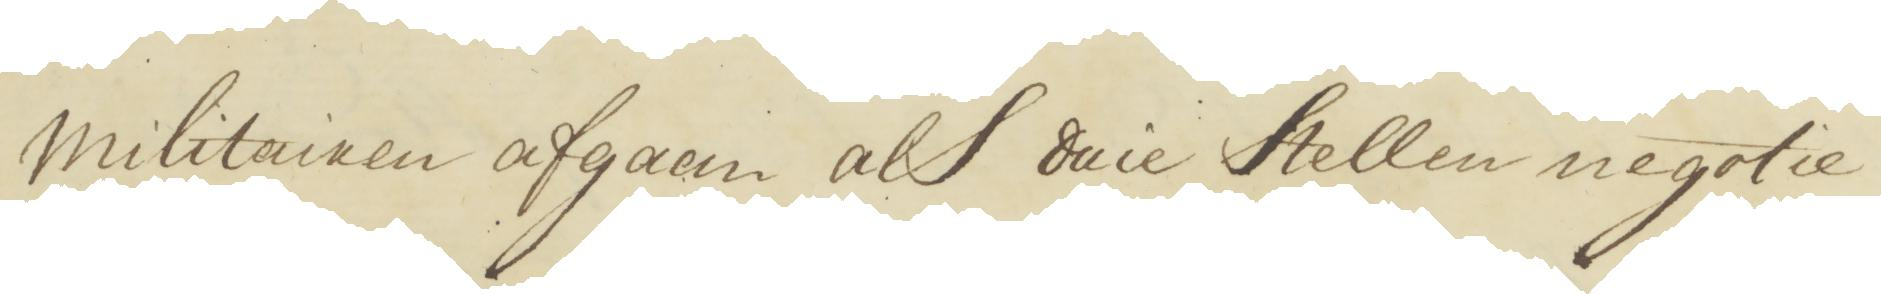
militairen afgaan als drie stellen negotie
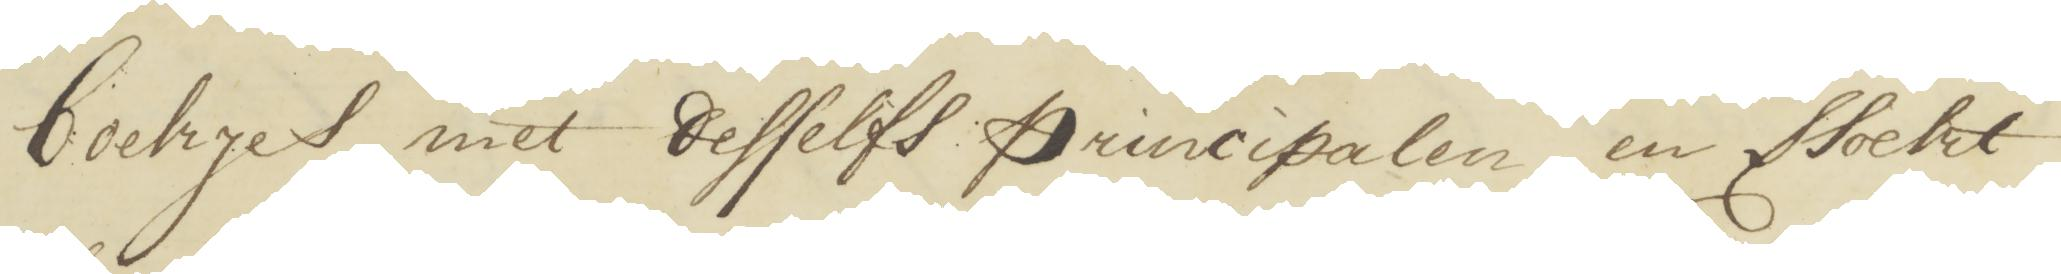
boekjes met desselfs Principalen en versoekt
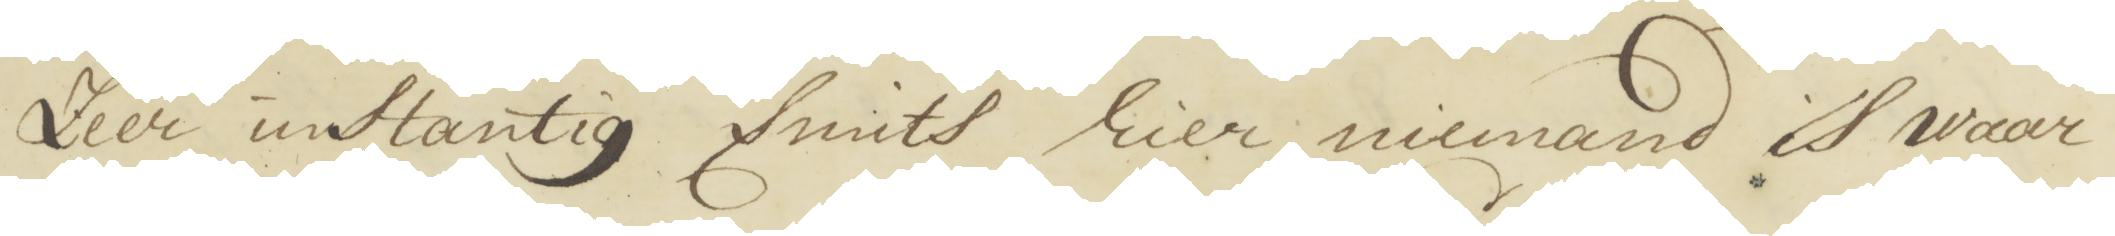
zeer instantig vermits hier niemand is waar
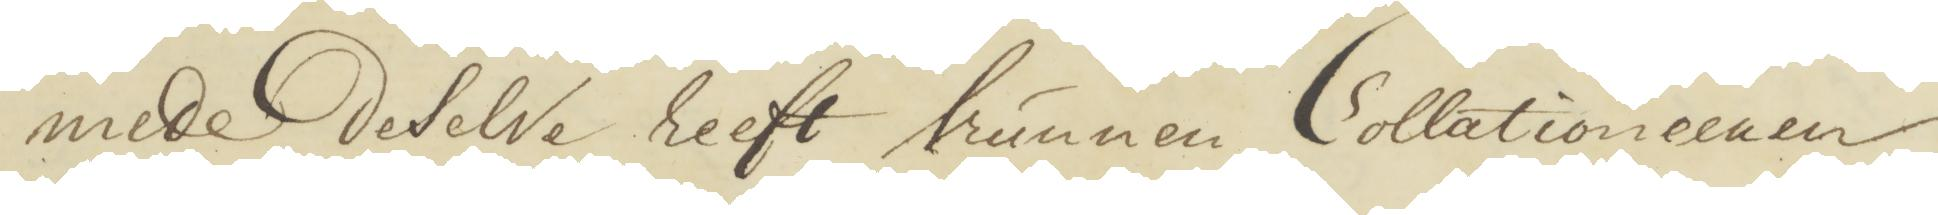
mede deselve heeft kunnen Collationeeren
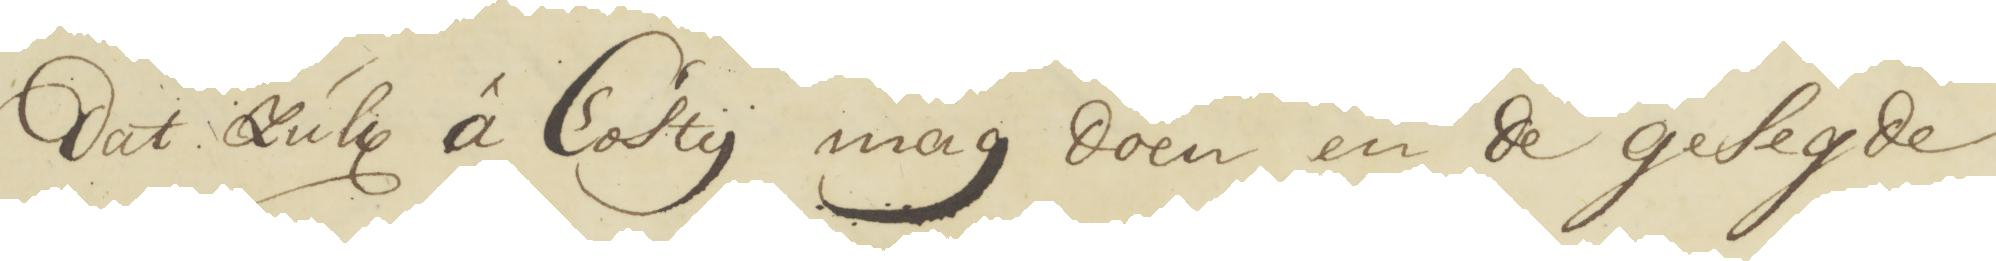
dat zulx â Costij mag doen en de gesegde
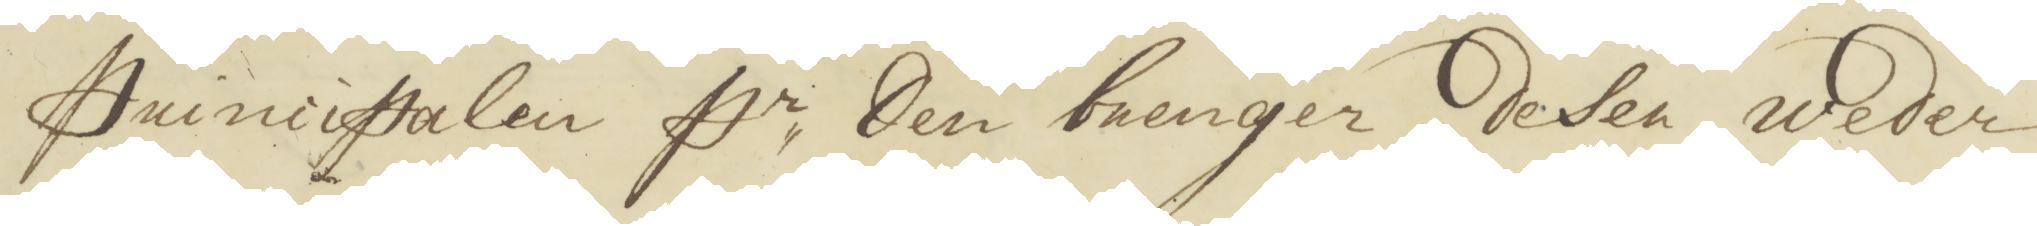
Principalen p„r den brenger deser weder
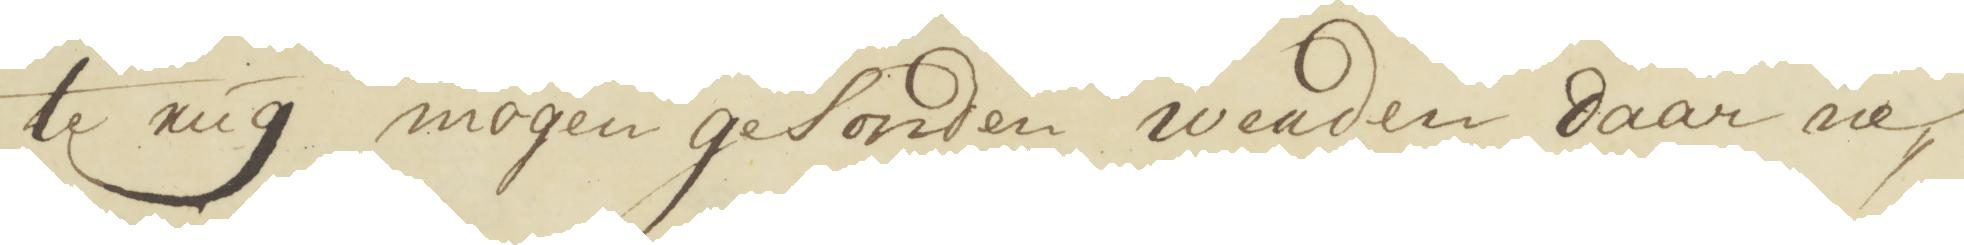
te rug mogen gesonden werden daar ne„
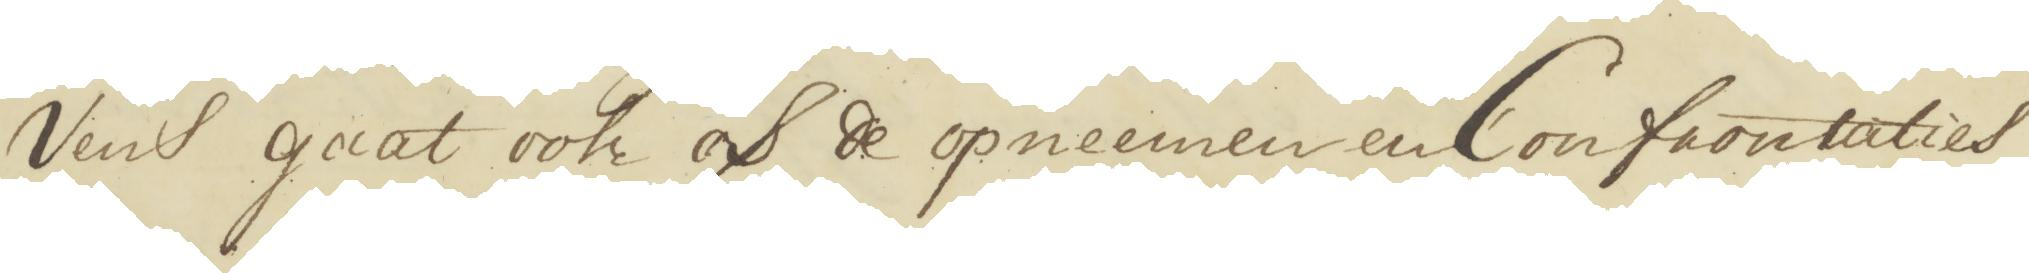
vens gaat ook over de opneemen en Confrontaties
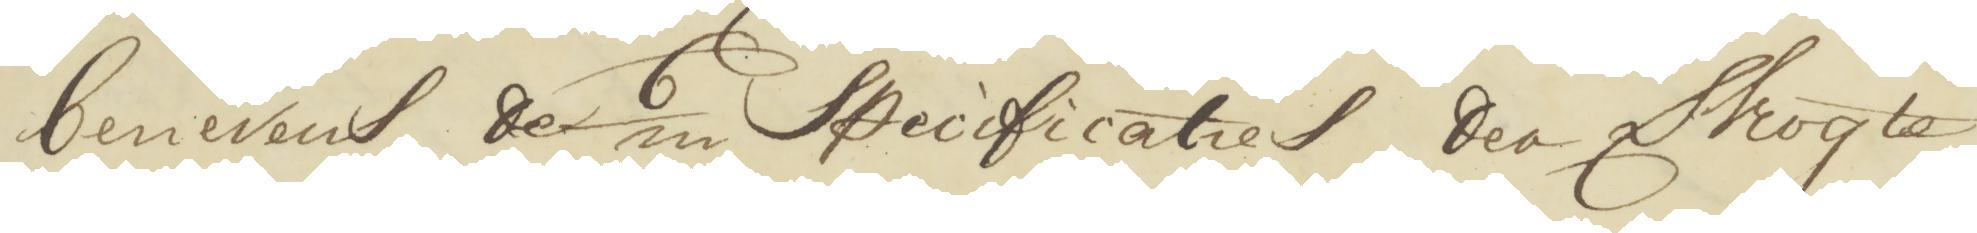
benevens de 6/m specificaties der verkogte
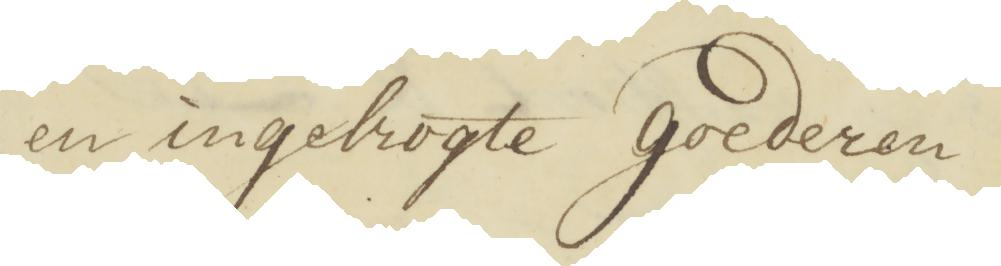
en ingekogte goederen
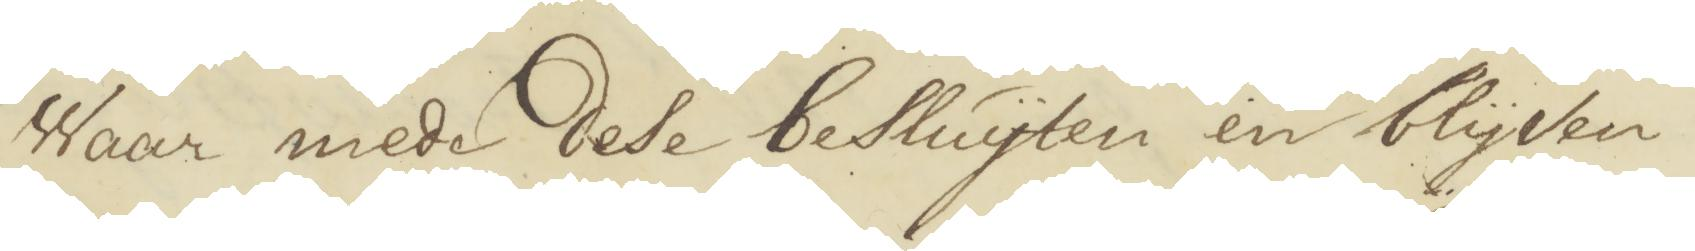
Waar mede dese besluijten en blijven
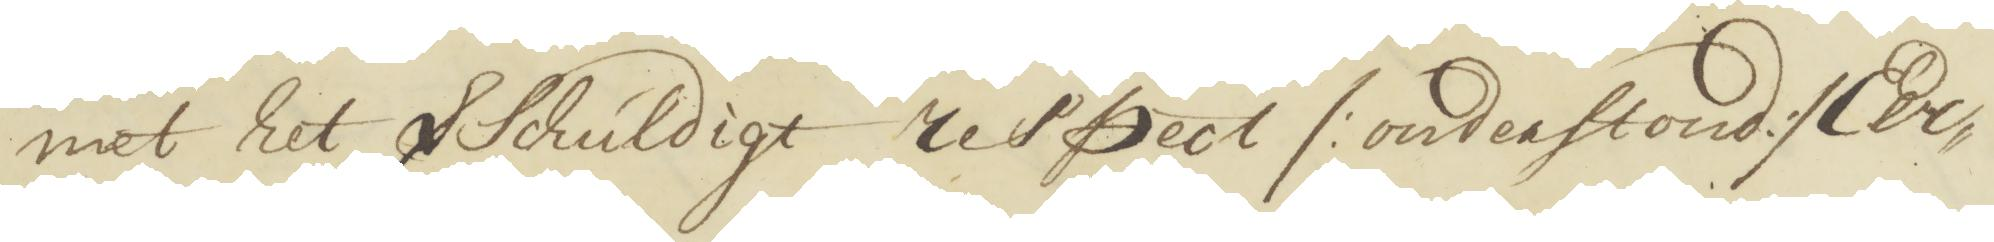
met het verschuldigt respect /: onderstond :/ Eer„
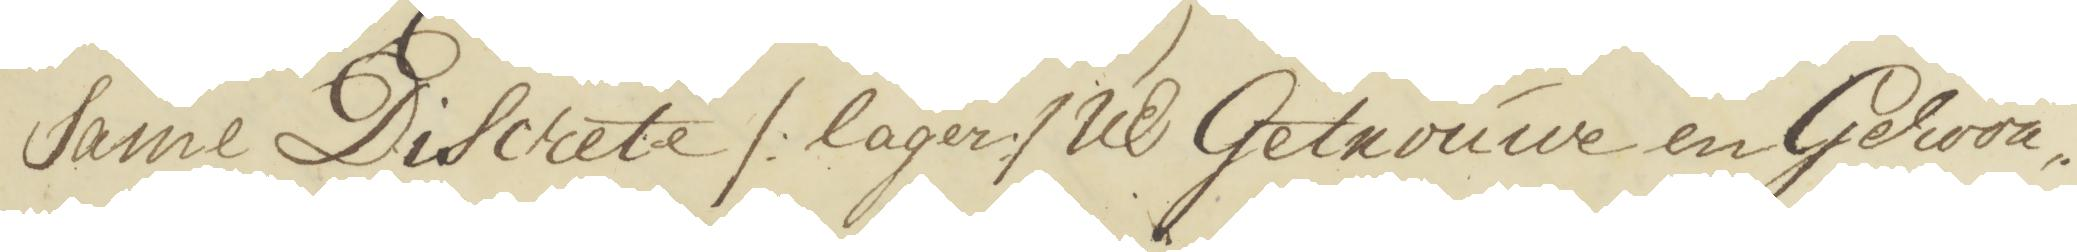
same Discrete /: lager :/ UE Getrouwe en Gehoor„
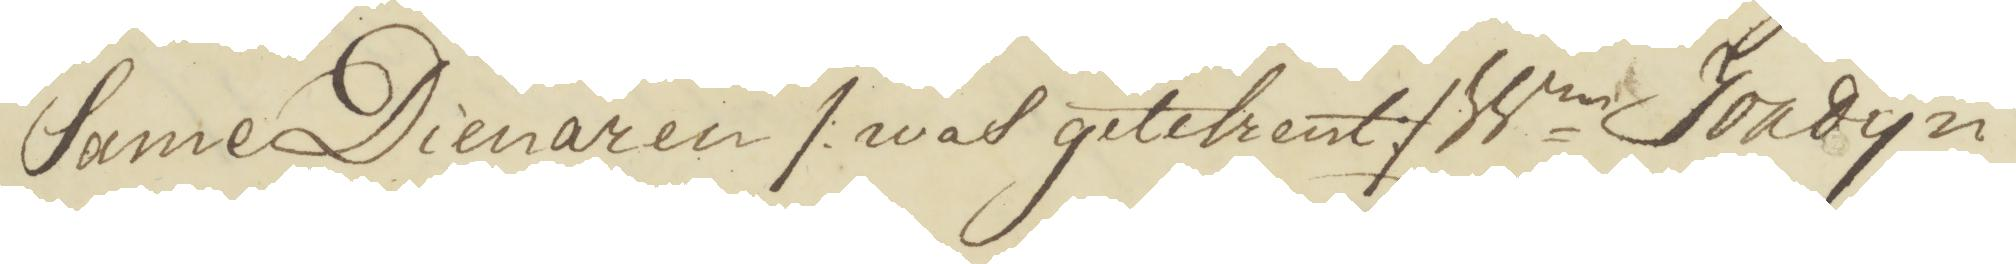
same Dienaren /: was getekent :/ W=m Iordijn
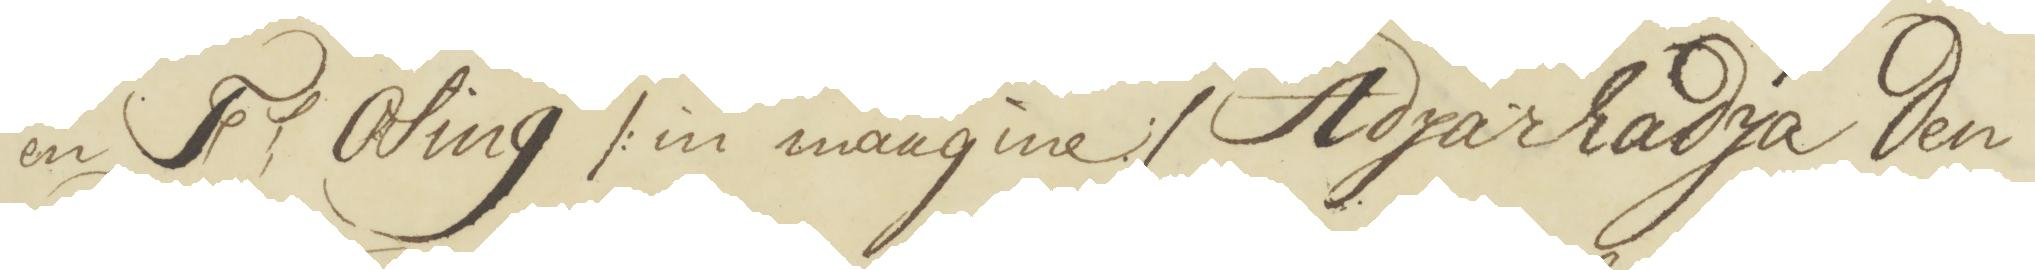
en F„s Osing /: in margine :/ Adjarhadja den
